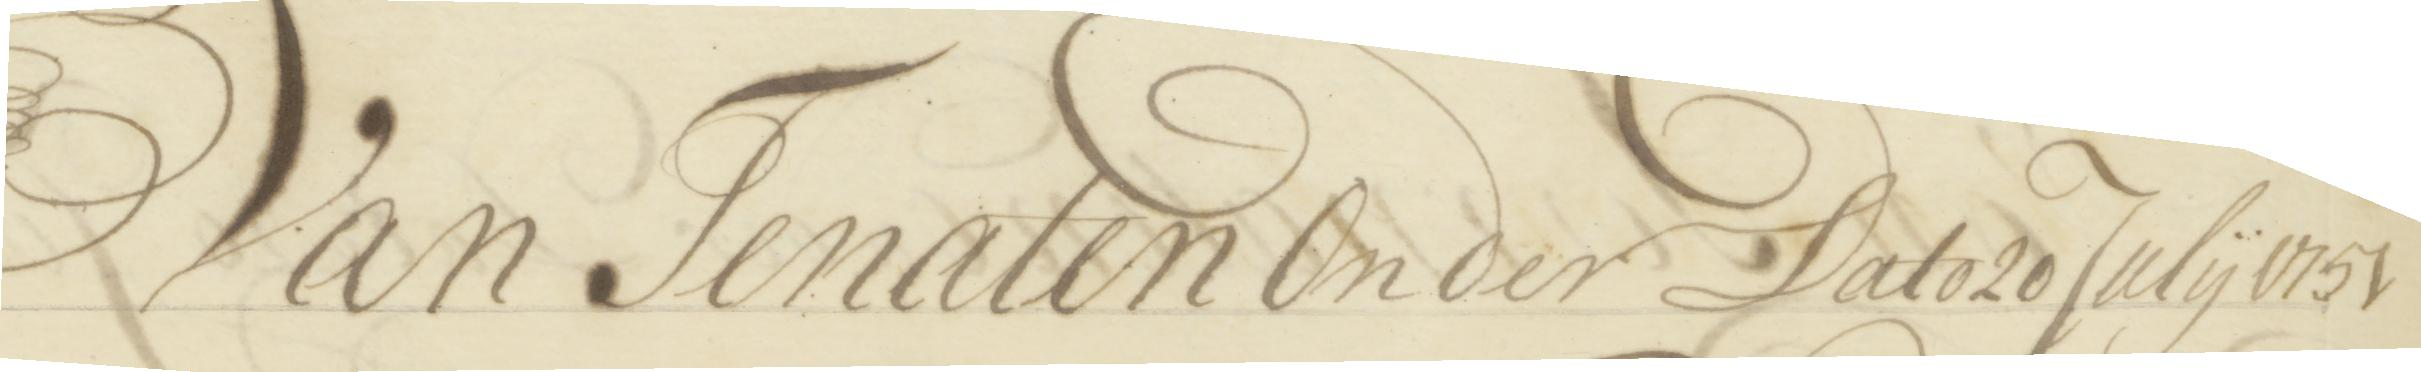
Van Ternaten onder Dato 20 Julij 1751
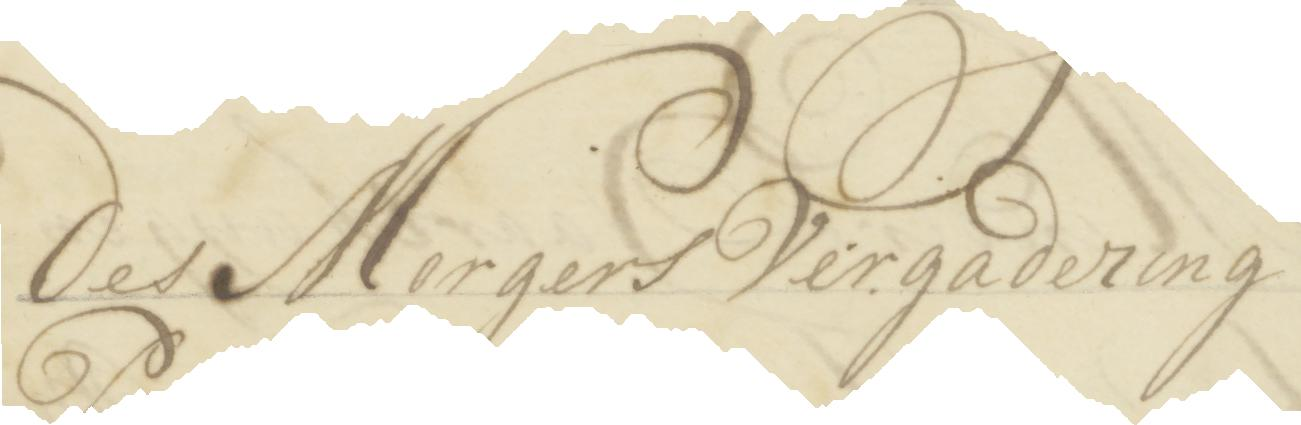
des Morgers Vergadering
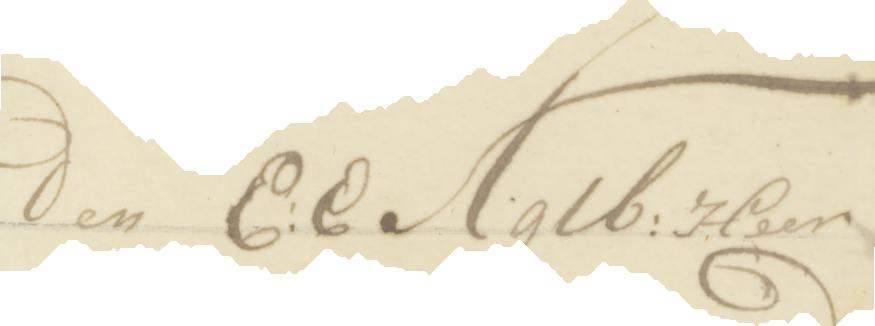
den E:E Agtb: Heer
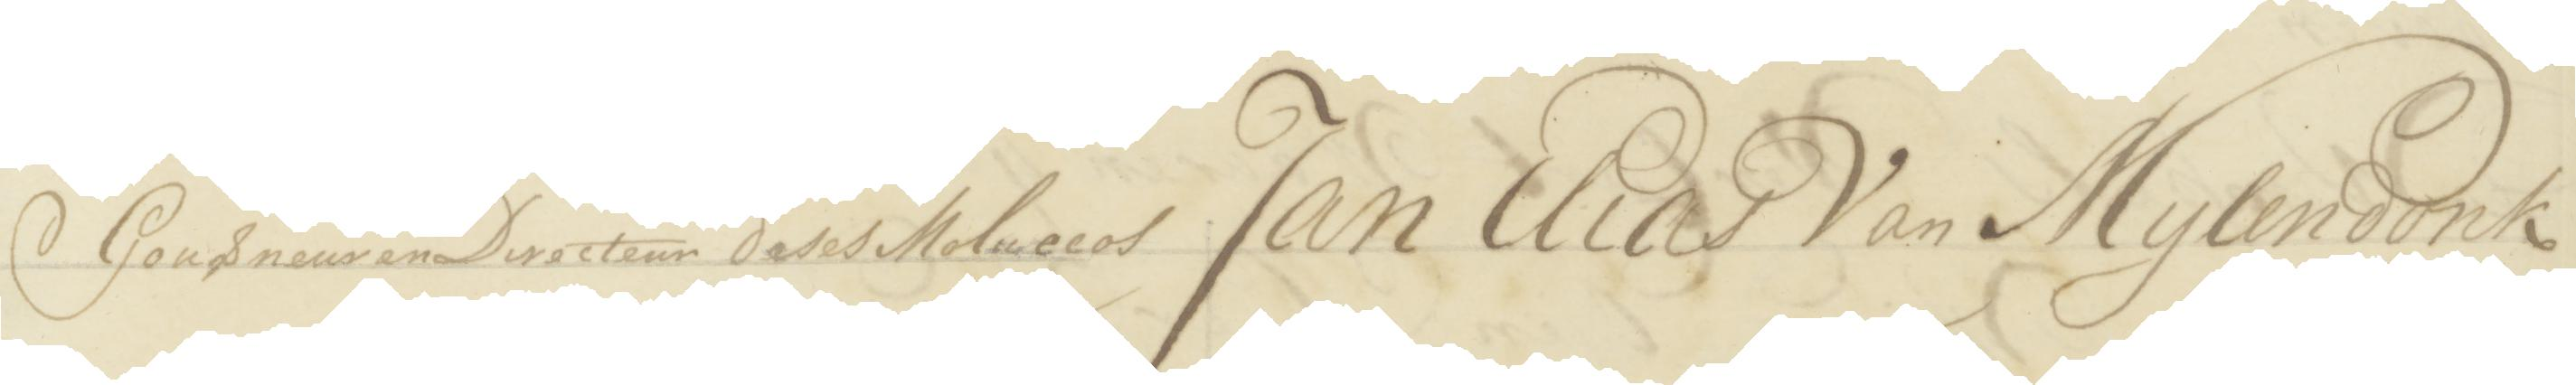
Gouverneur en Directeur deses Moluccos Jan Elias Van Mylendonk
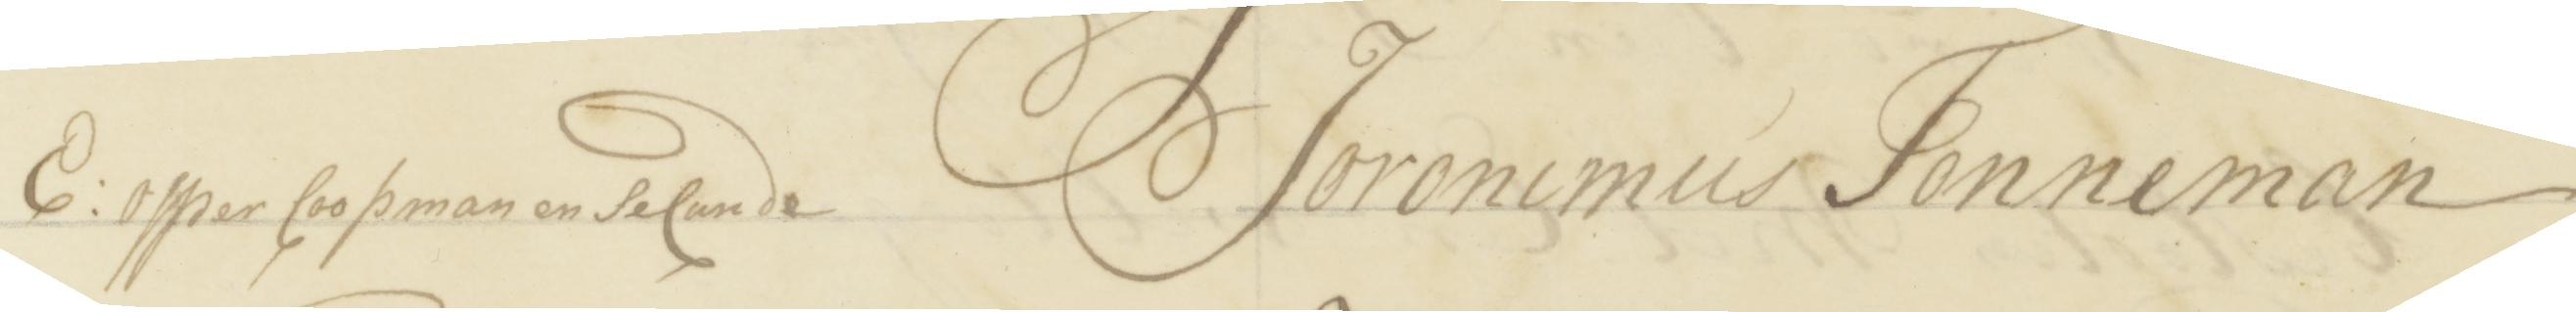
E: opper: Coopman en secunde Joronimus Tonneman
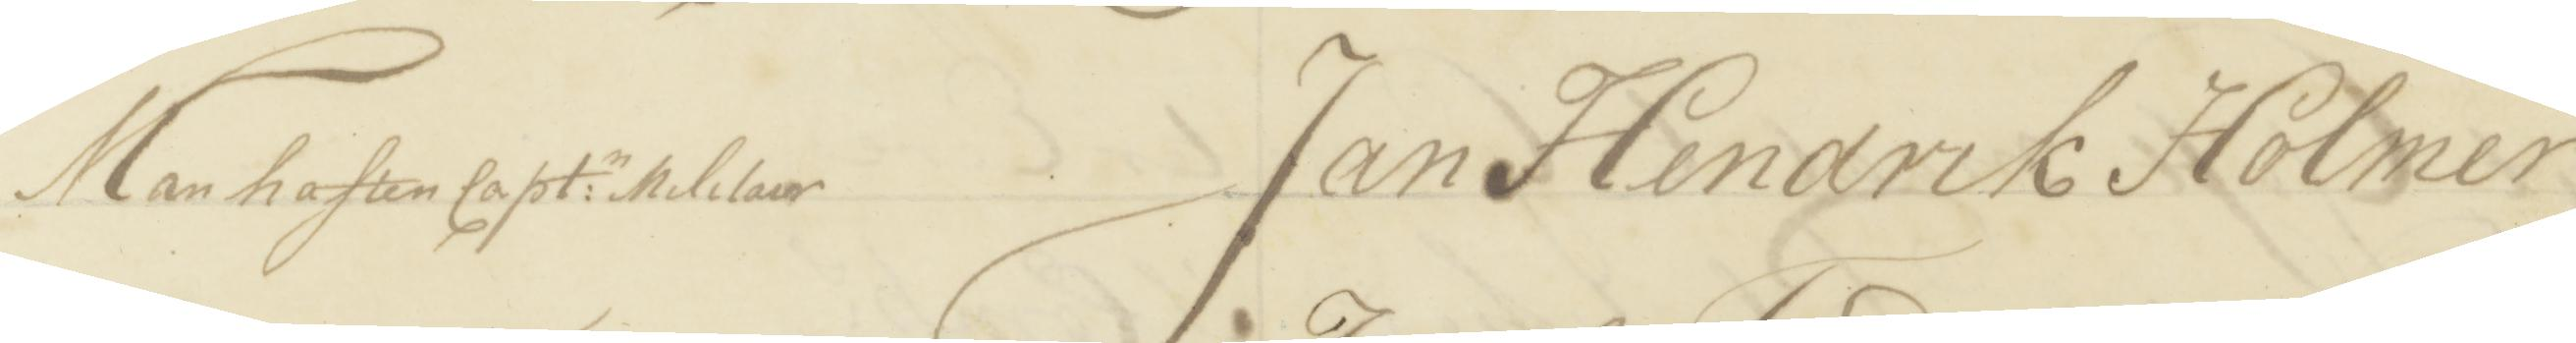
Manhaften Capt:n Militair Jan Hendrik Holmer
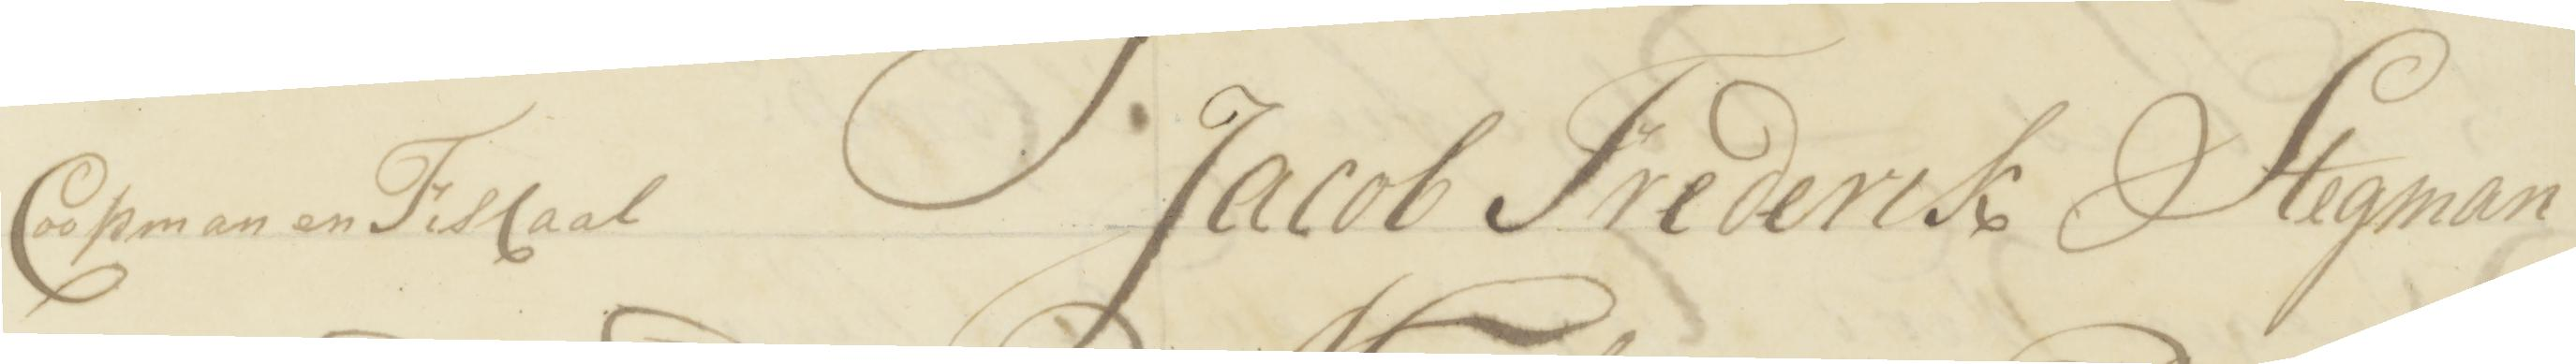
Coopman en Fiscaal Jacob Frederik Stegman
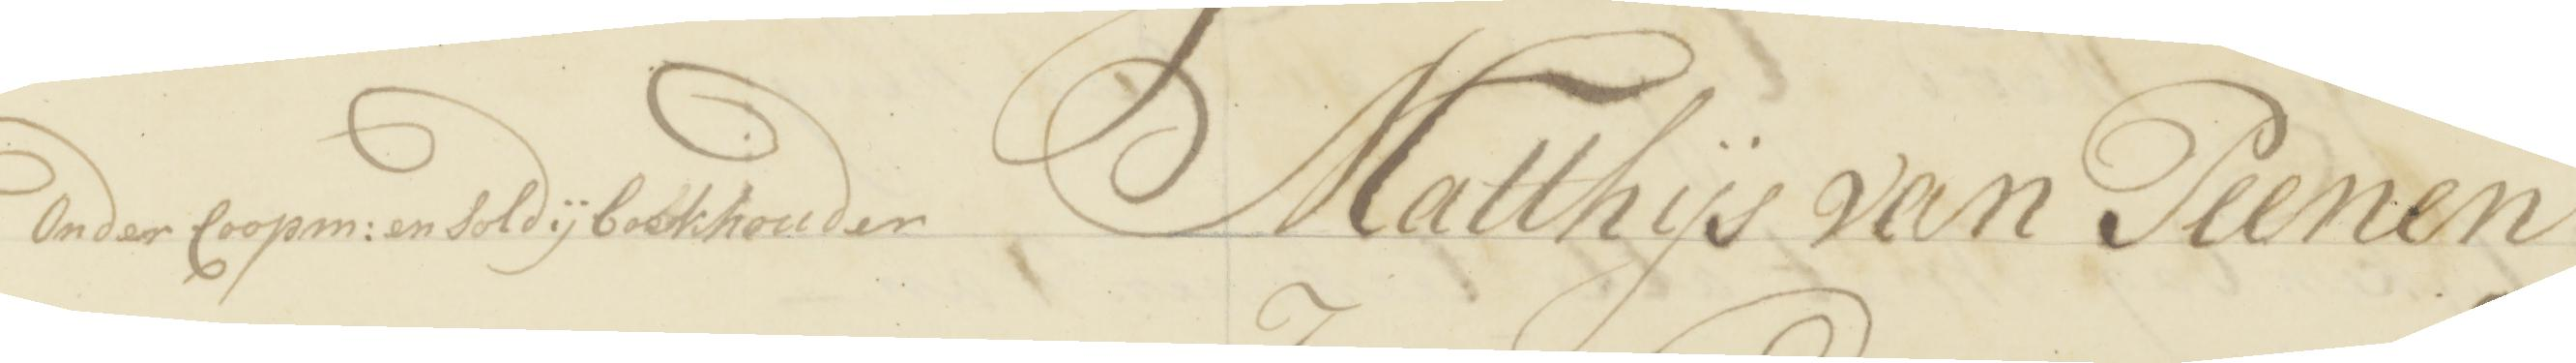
onder Coopm: en soldij boekhouder Matthijs van Peenen
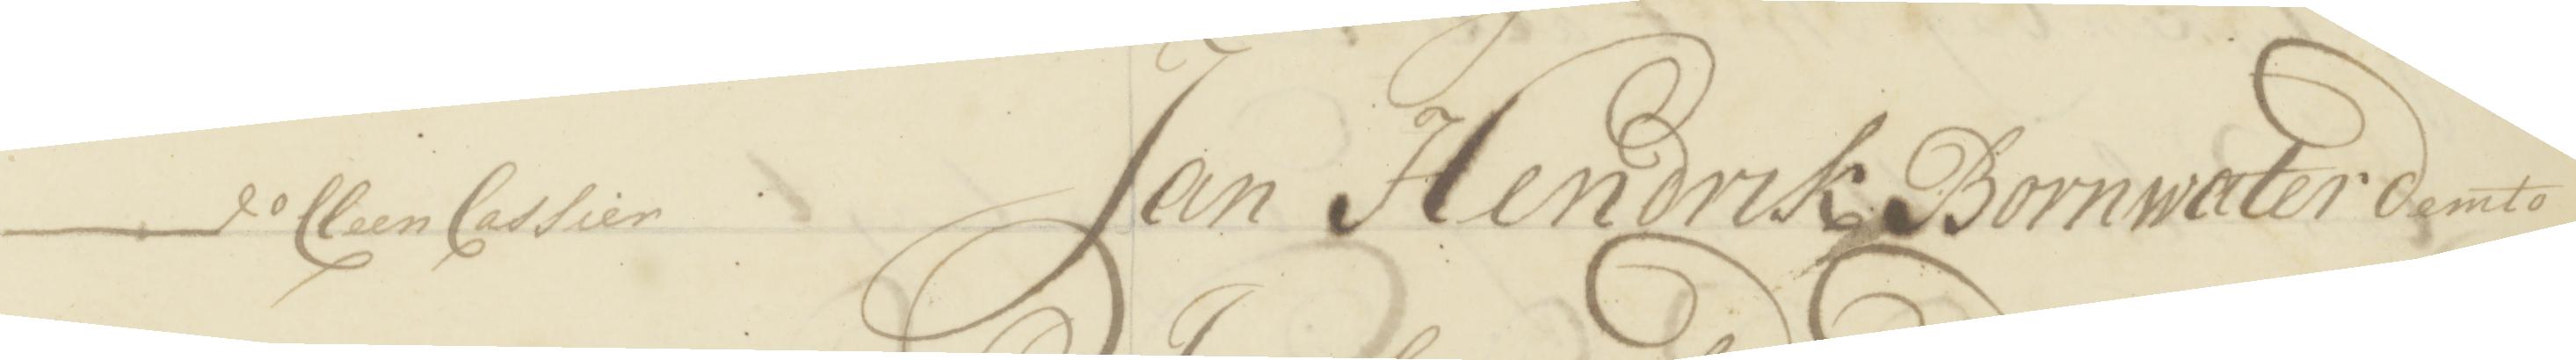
_o Cleen Cassier Jan Hendrik Bornwater demto
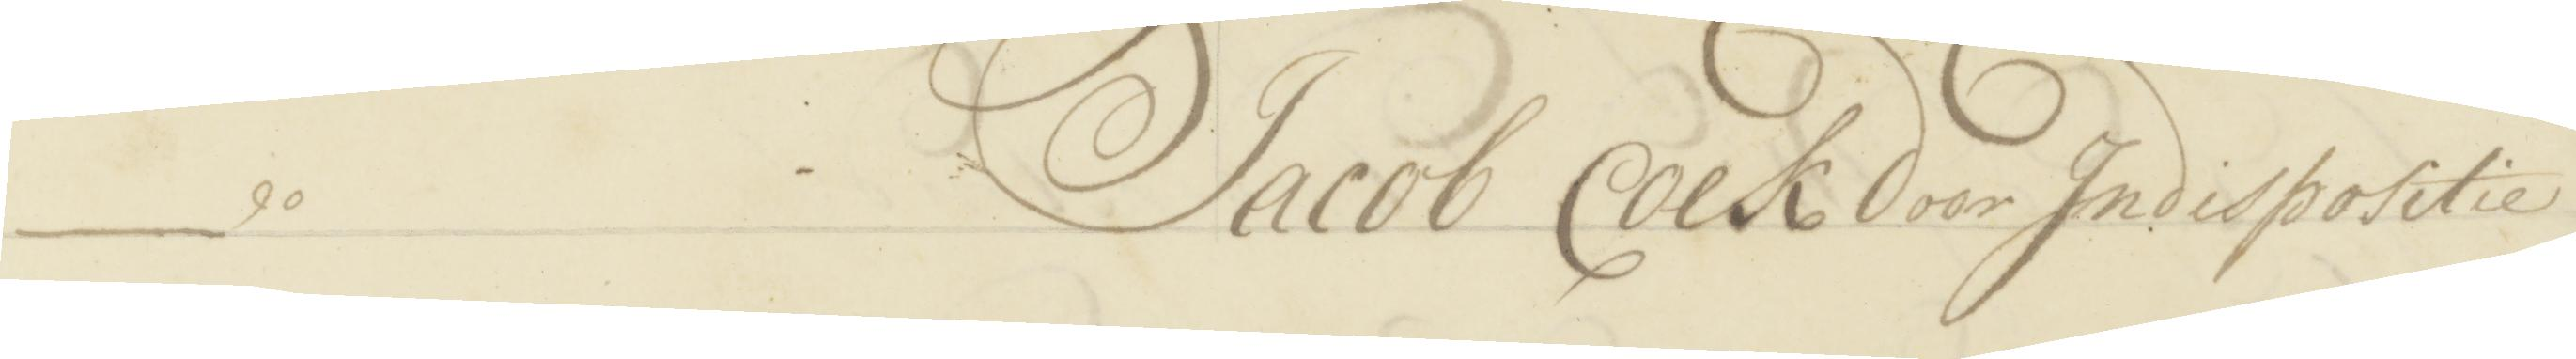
_o Iacob Coek door Jndispositie
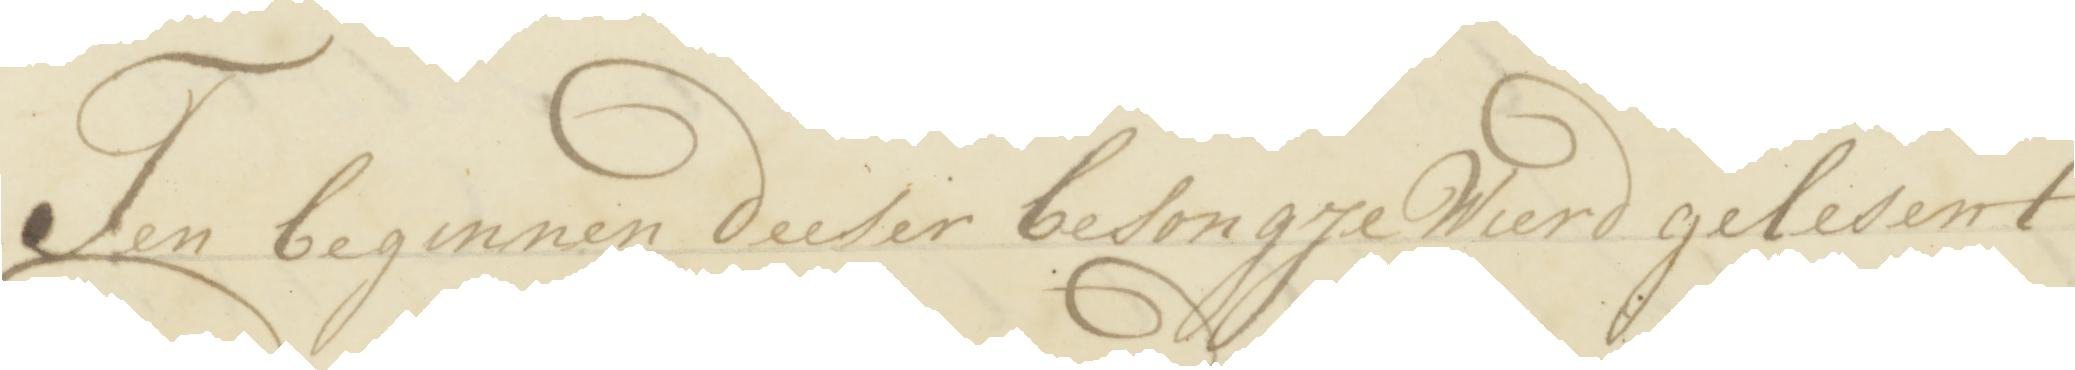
Ten beginnen deeser besongje wierd gelesent
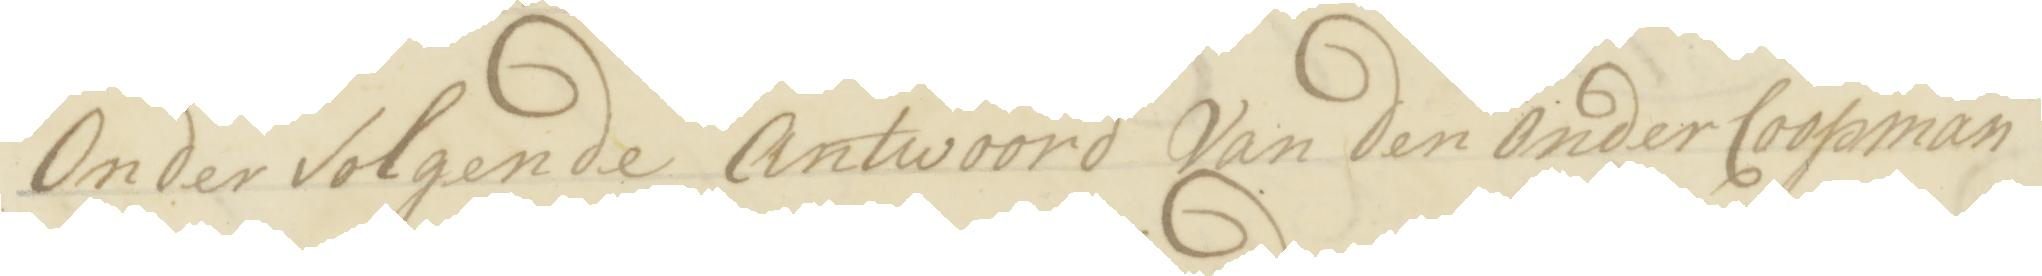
onder volgende antwoord van den onder Coopman
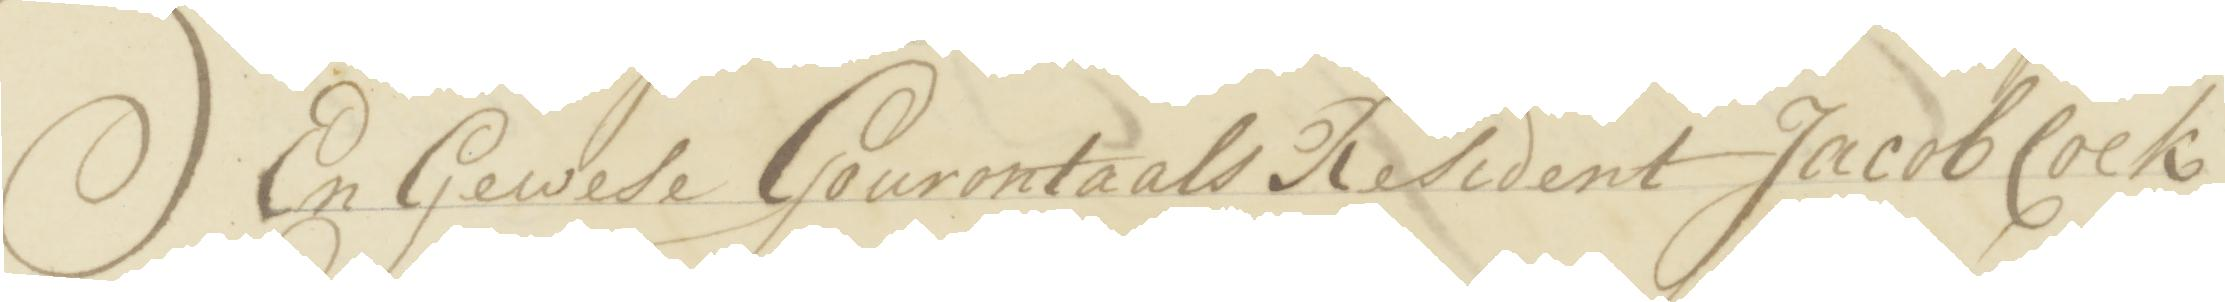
En Gewese Gourontaals Resident Jacob Coek
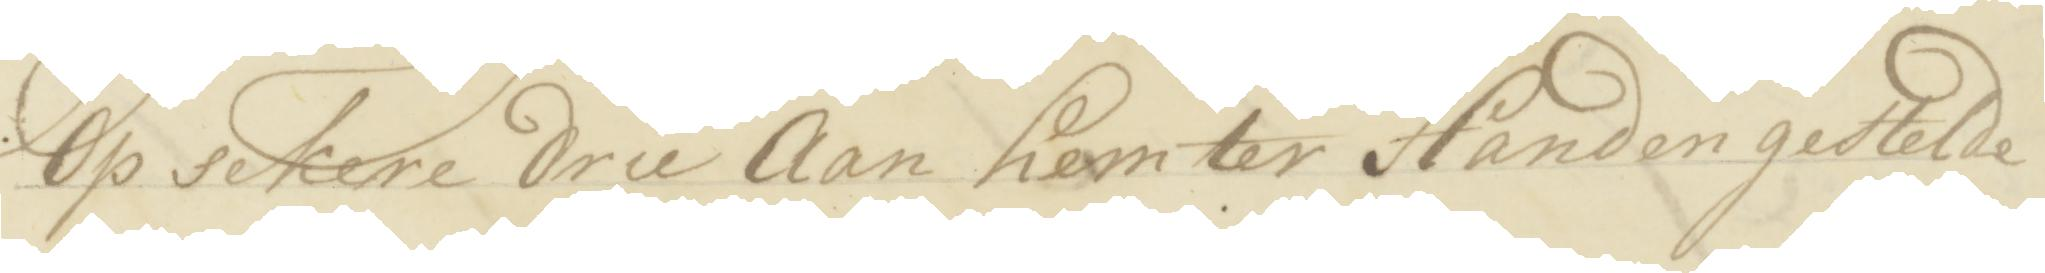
op sekere drie aan hem ter Handen gestelde
